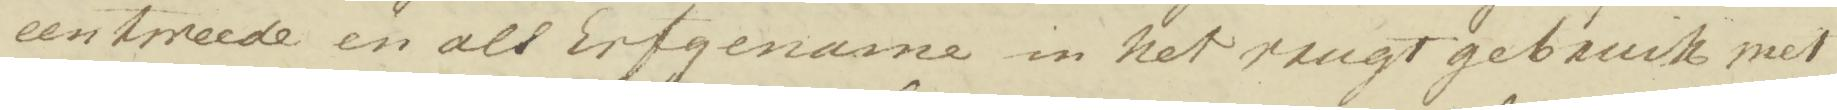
een tweede en als Erfgename in het vrugtgebruik met
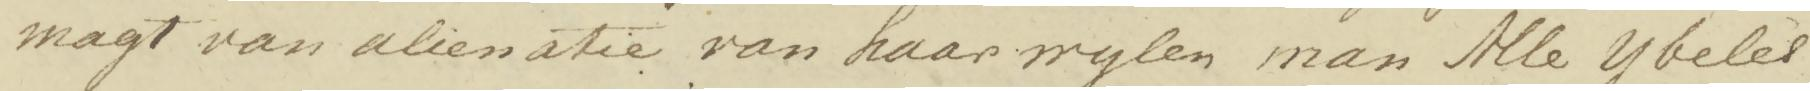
magt van alienatie van haar wylen man Alle Ybeles
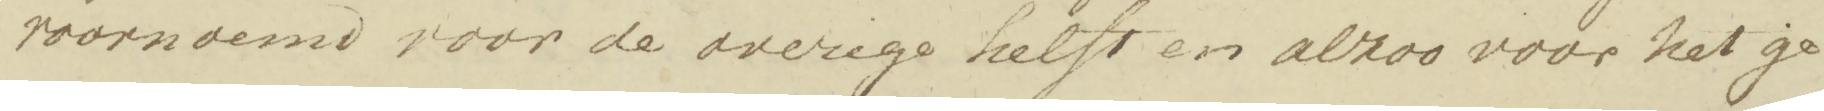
voornoemd voor de overige helft en alzoo voor het ge
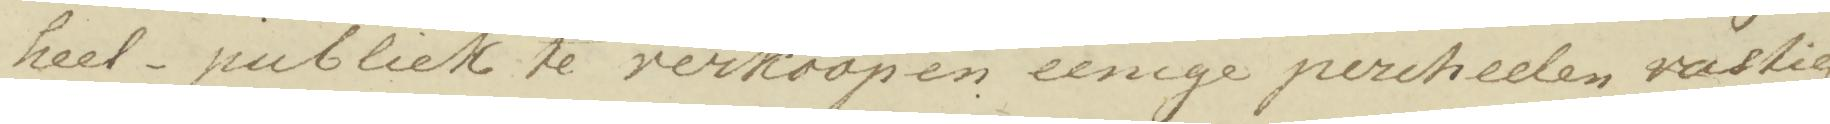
heel - publiek te verkoopen, eenige percheelen vastig
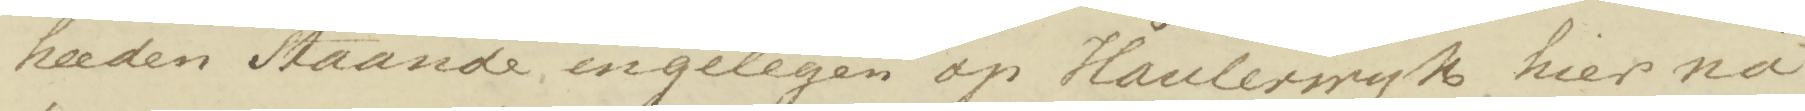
heeden staande en gelegen op Haulerwijk hier na
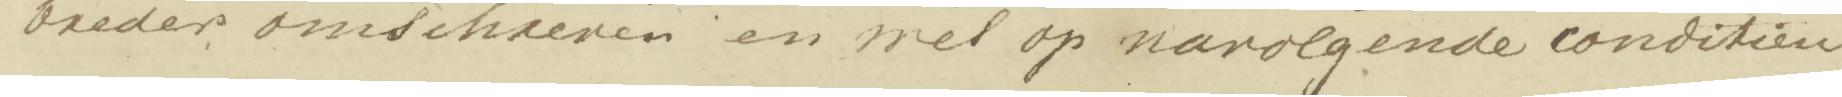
breder omschreven en wel op navolgende conditien
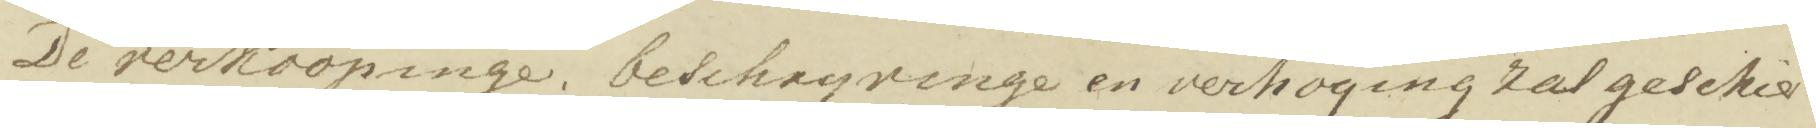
De verkoopinge, beschryvinge en verhoging zal geschie
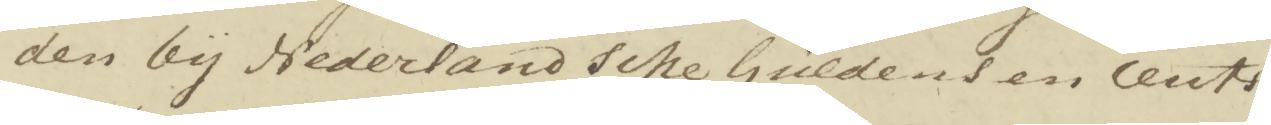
den bij Nederlandsche Guldens en cents.
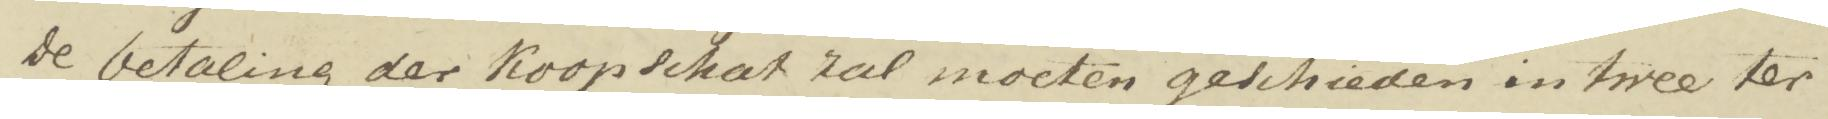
De betaling der koopschat zal moeten geschieden in twee ter
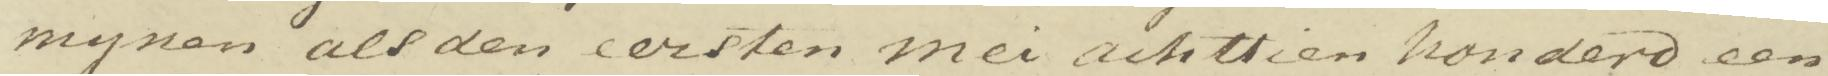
mynen als den eersten mei achttien honderd een
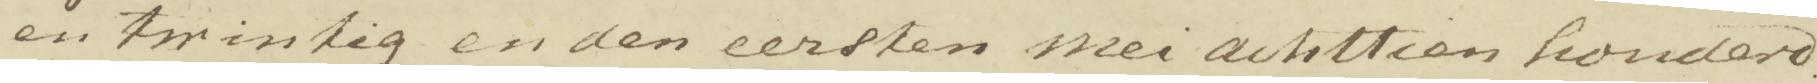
en twintig en den eersten mei achttien honderd
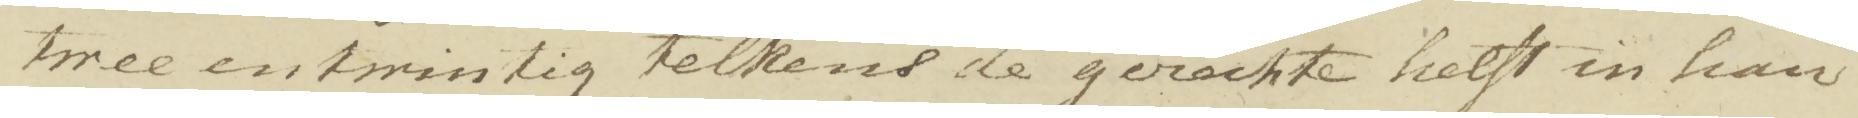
twee en twintig telkens de gerechte helft in han
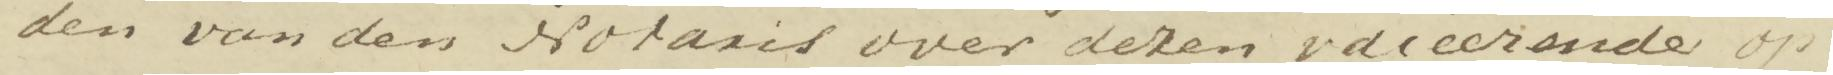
den van den Notaris over dezen vaceerende op
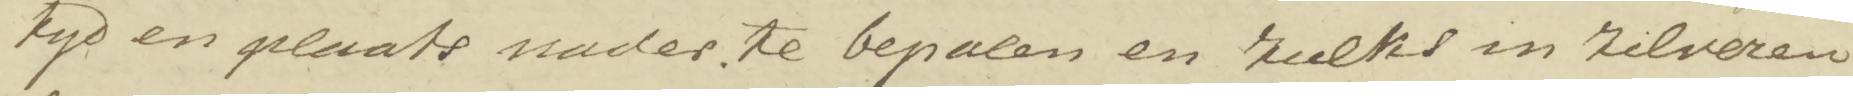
tyd en plaats nader te bepalen en zulks in zilveren
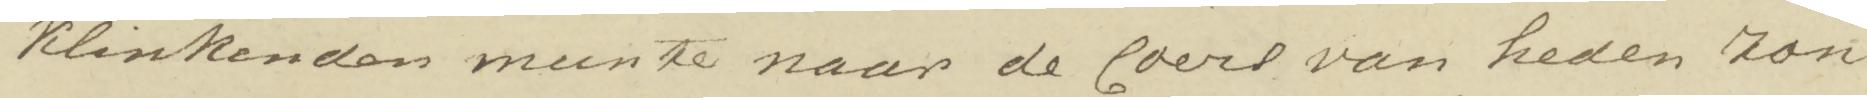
klinkenden munte naar de Coers van heden zon
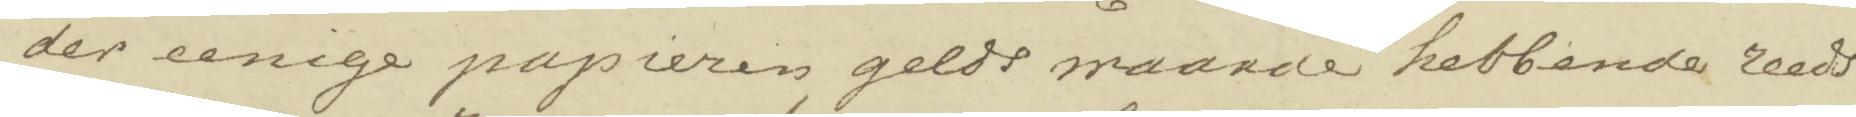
der eenige papieren gelds waarde hebbende reeds
